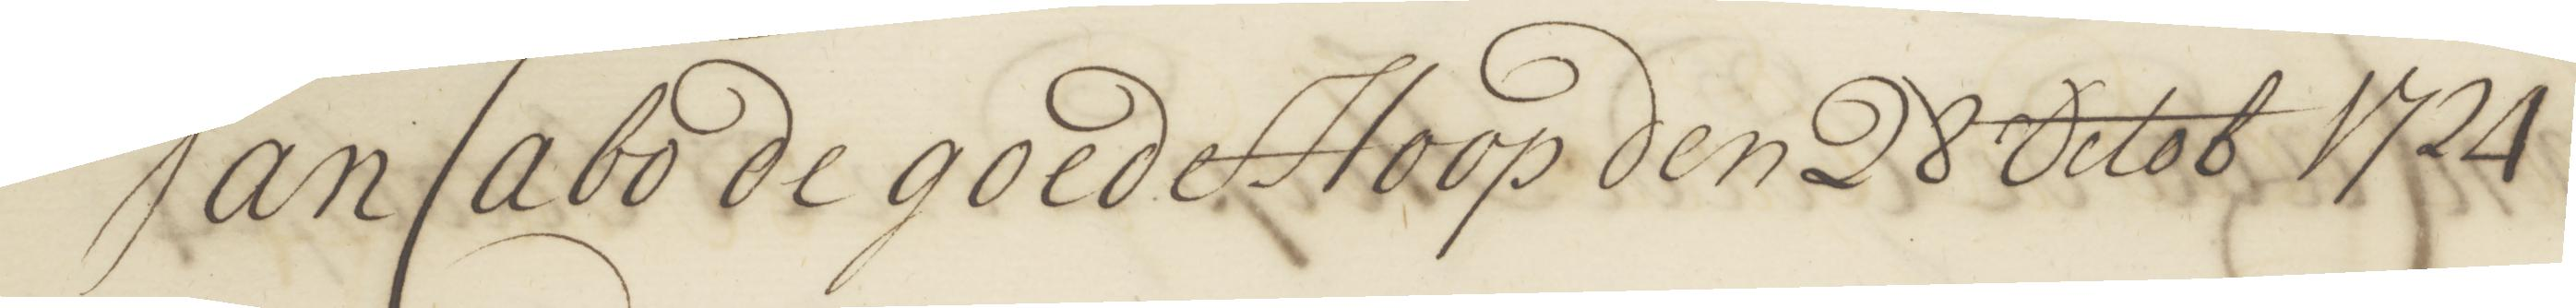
Van Cabo de goede Hoop den 28' Octob 1724
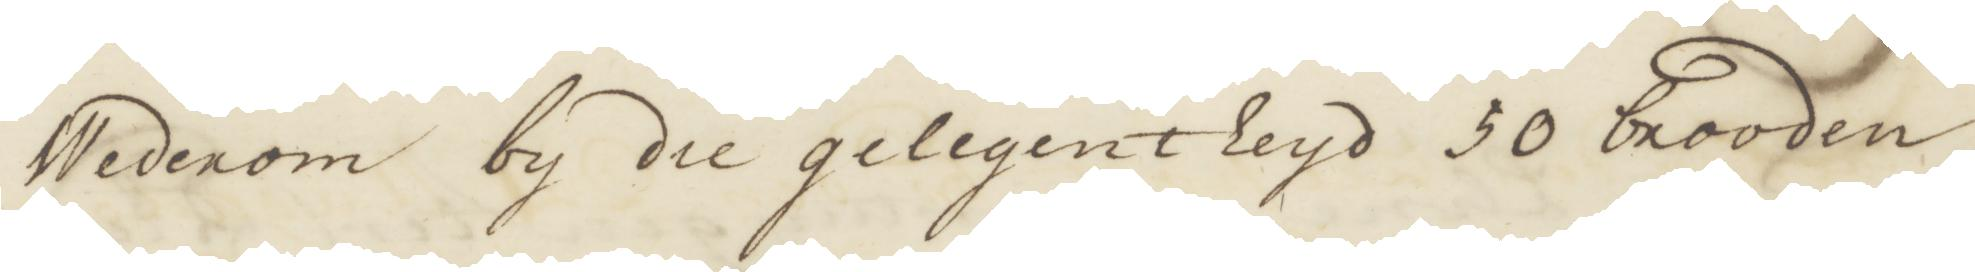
Wederom by die gelegentheyd 50 brooden
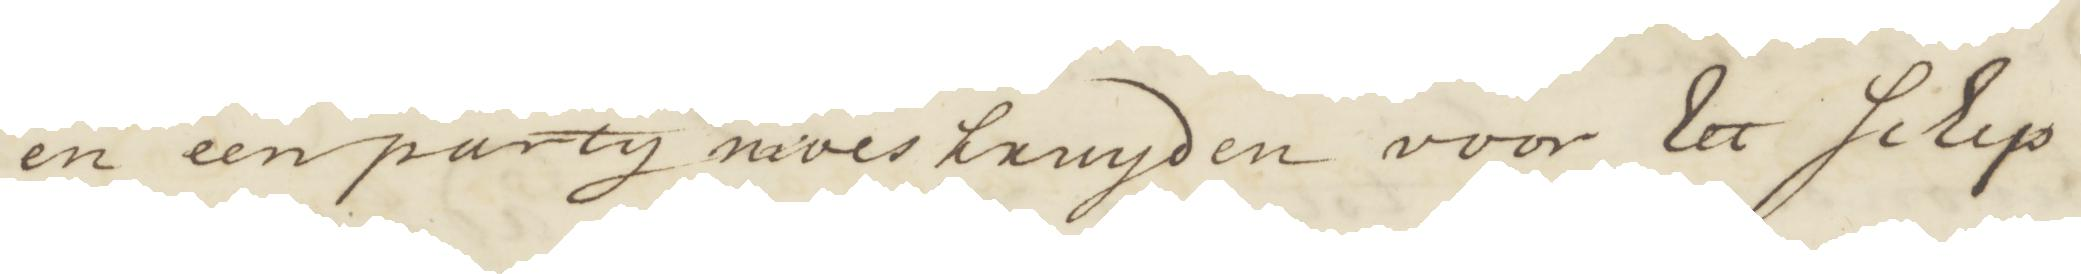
en een party moeskruyden voor het schip
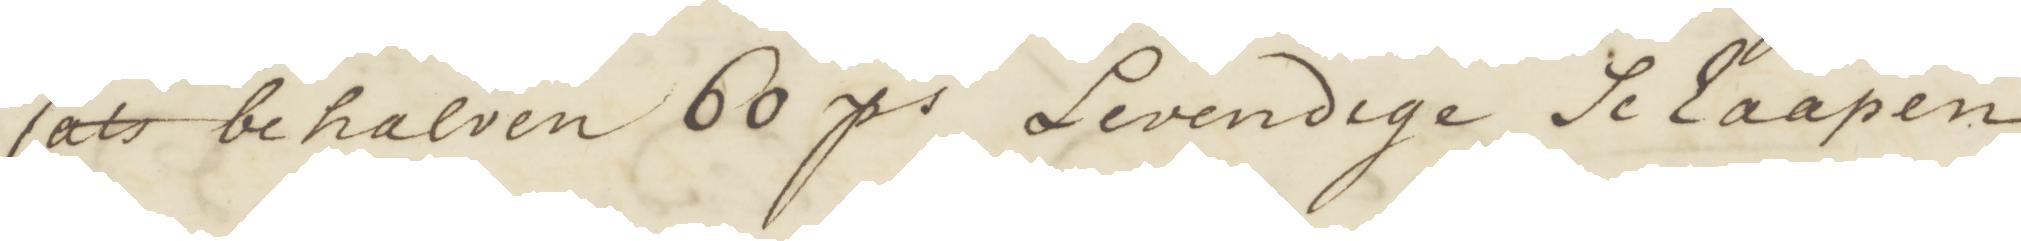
Cats behalven 60 ps Levendige schaapen
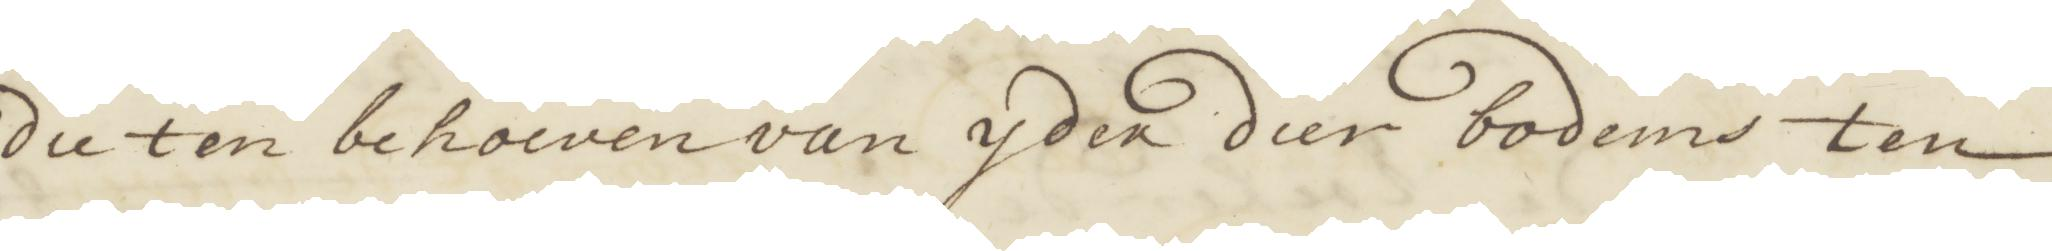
die ten behoeven van yder dier bodems ten
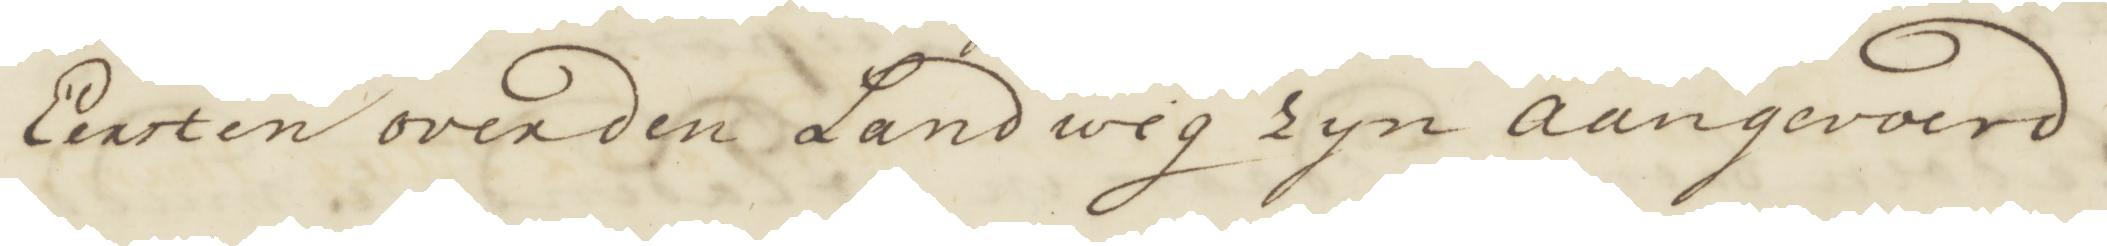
Eersten over den Landweg zyn aangevoerd
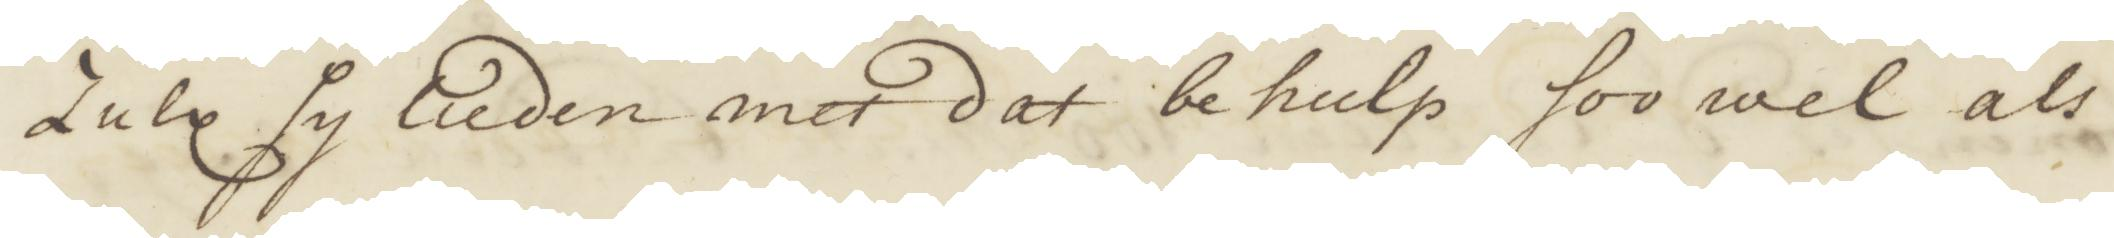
zulx sy lieden met dat behulp soo wel als
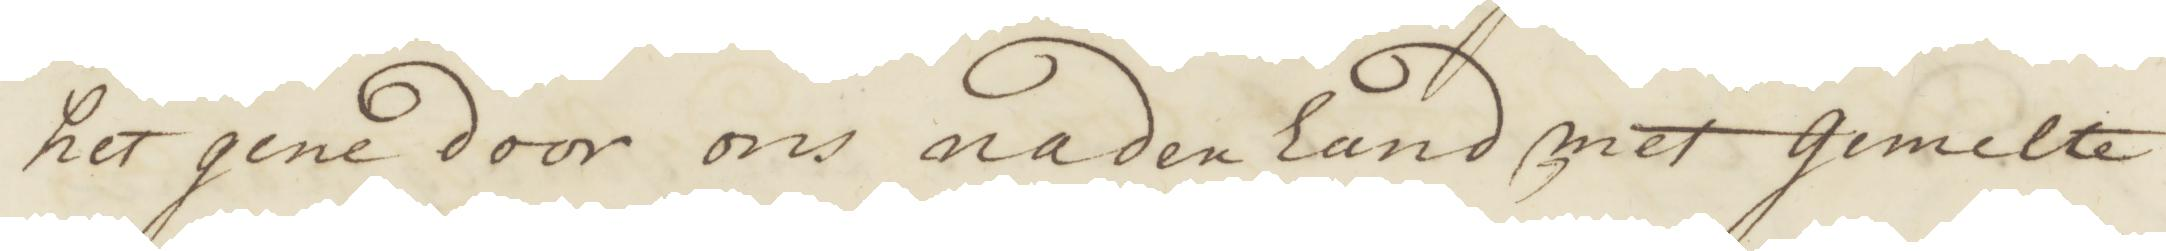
het gene door ons naderhand met gemelte
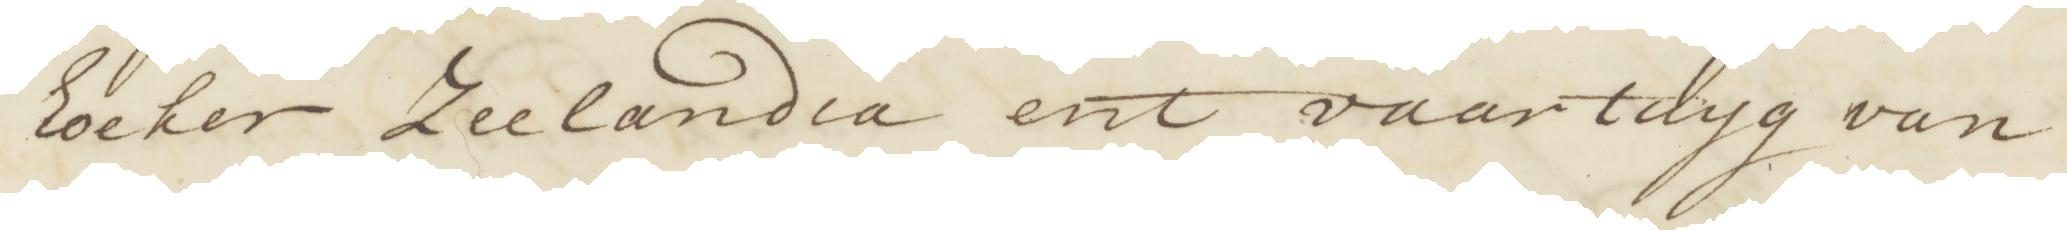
hoeker zeelandia ent vaartuyg van
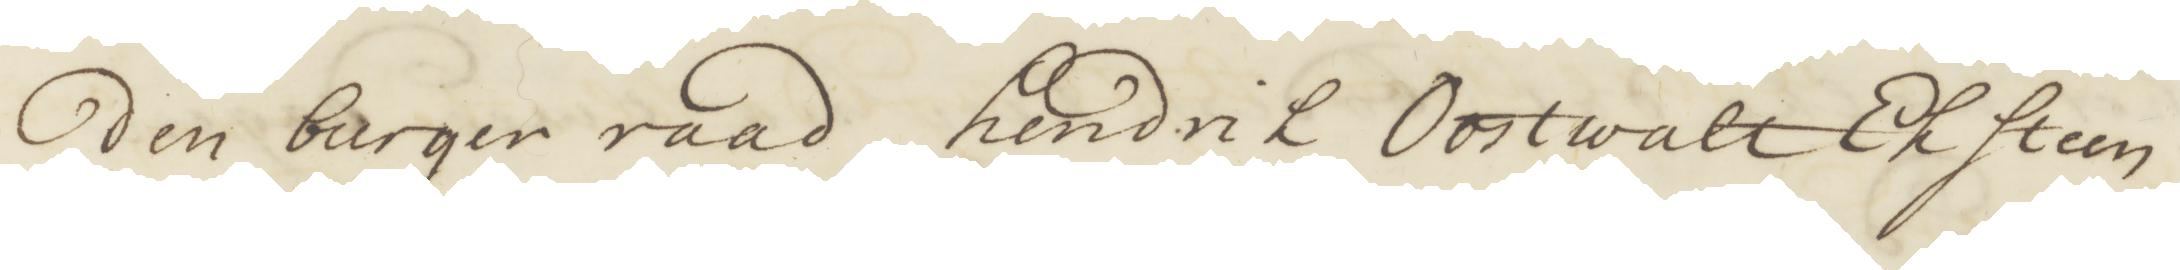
den burger raad hendrik Oostwalt Eksteen
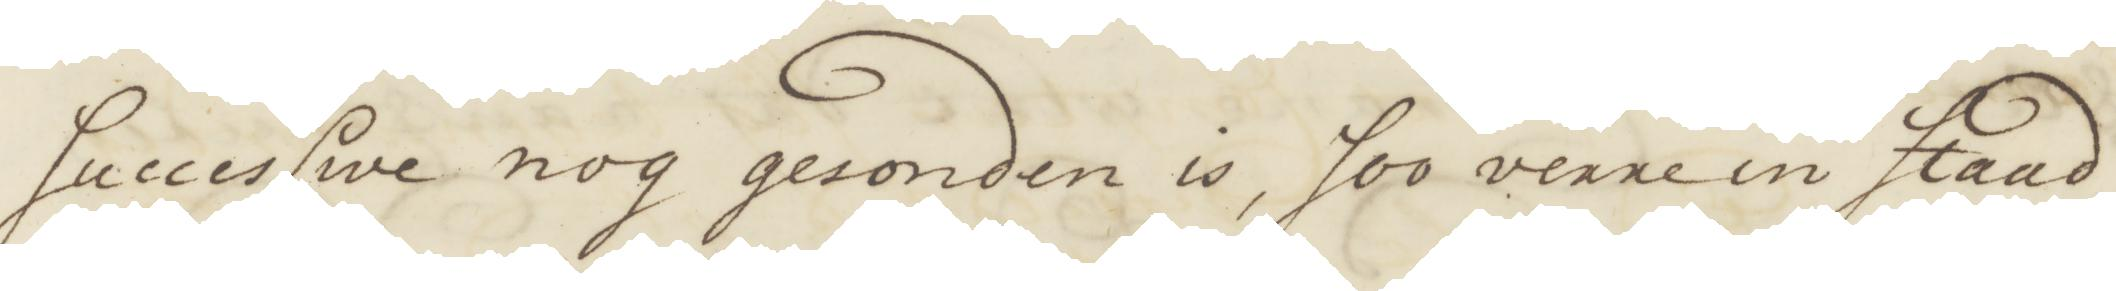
successive nog gesonden is, soo verre in staad
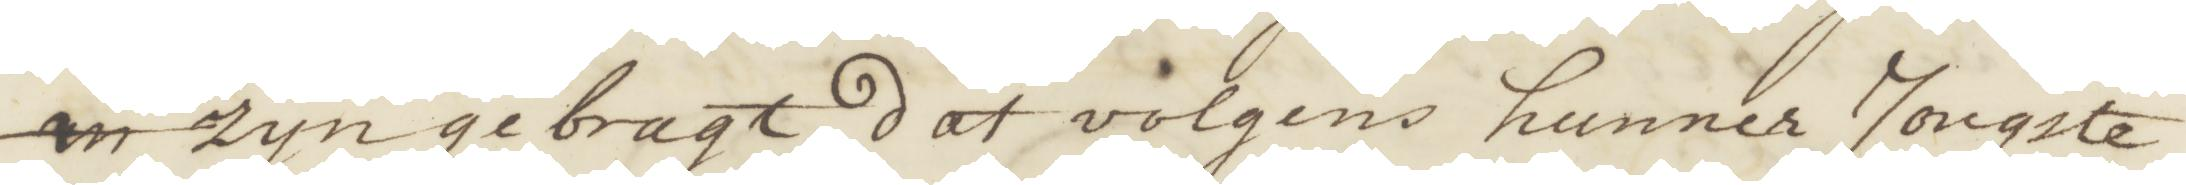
in zyn gebragt dat volgens hunner Jongste
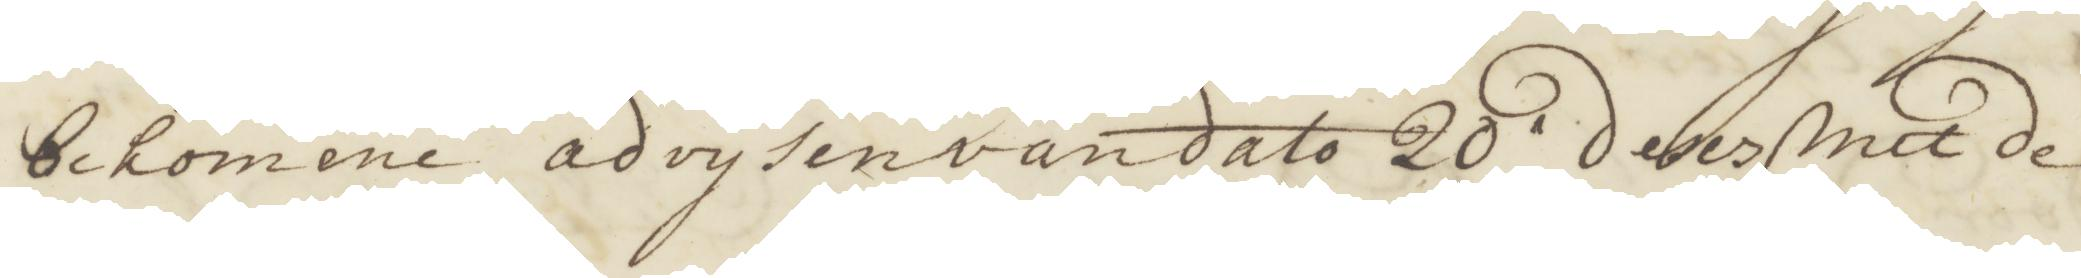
bekomene advysen van dato 20 deses met de
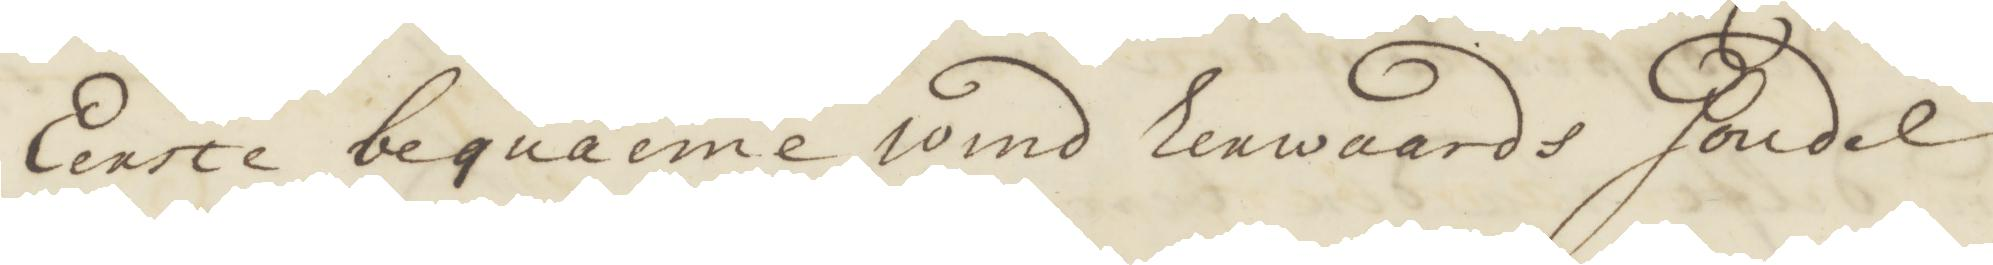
Eerste bequaeme wind herwaards soude
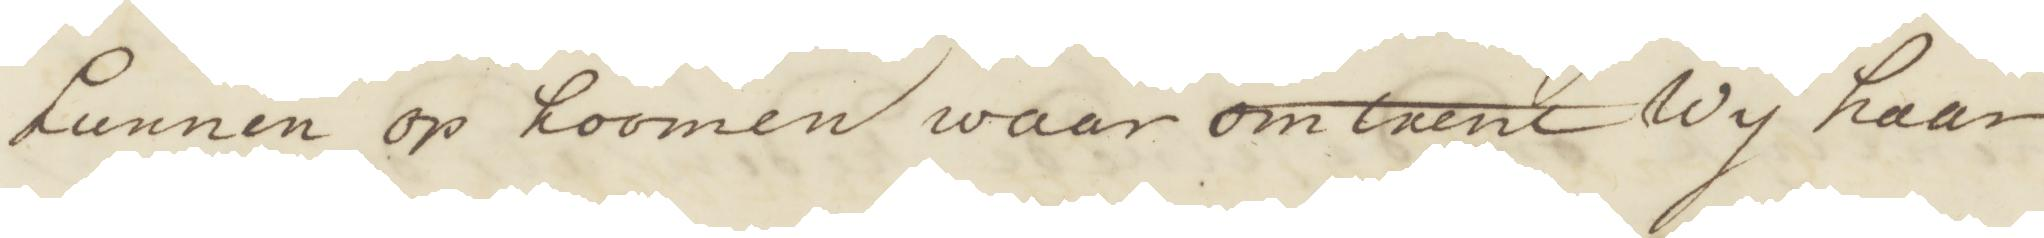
kunnen op koomen waar omtrent wy haar
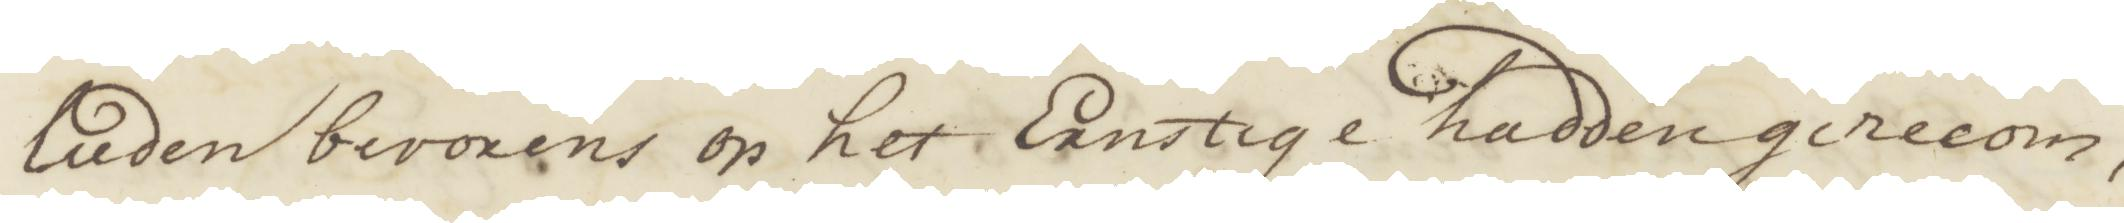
lieden bevorens op het Ernstige hadden gerecom,
